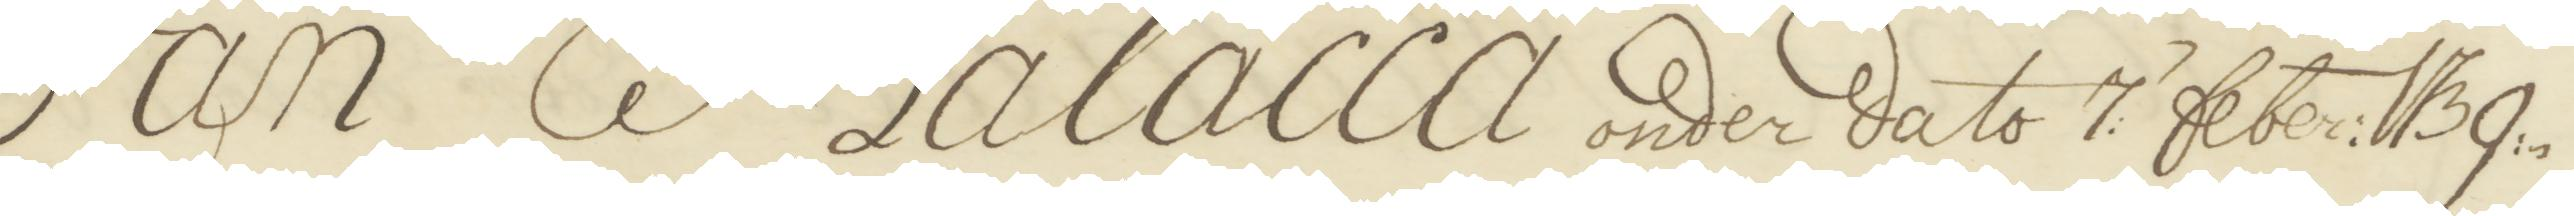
Van Malacca onder dato 7:' feber: 1739:-
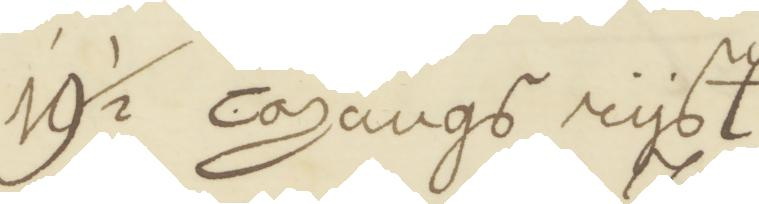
19½ cojangs rijst
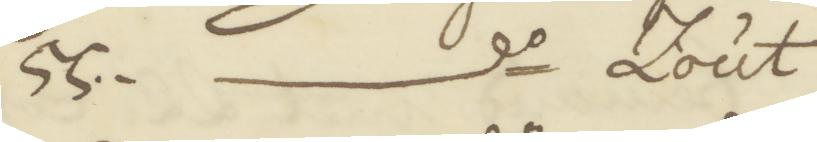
55.- _=o zout
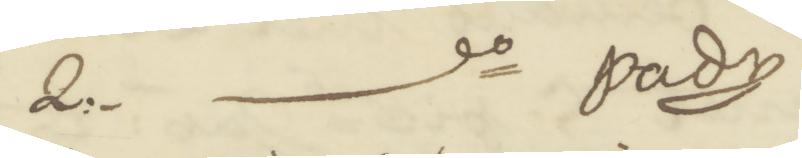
2:- _=o padij
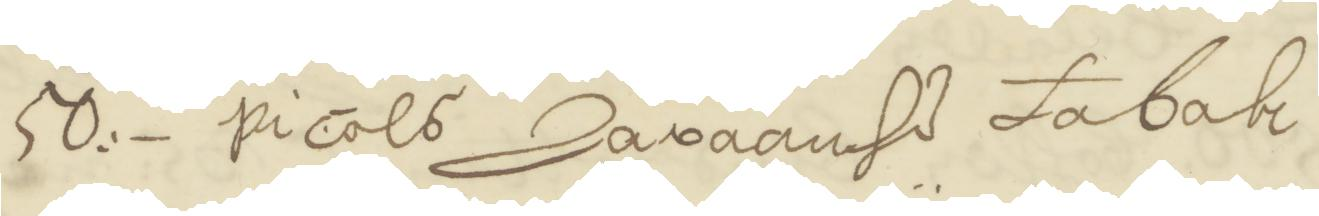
50:- picols Javaanse tabak
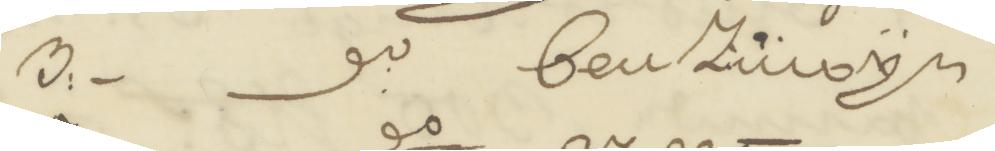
3.- _:o benzuivijn
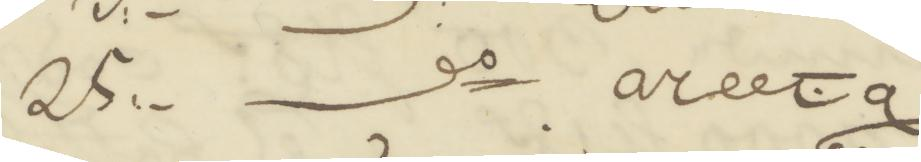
25:- _=o areecq
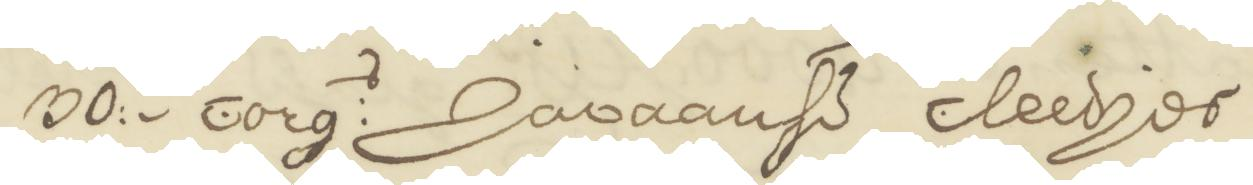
30:- Corg:s javaanse cleedjes
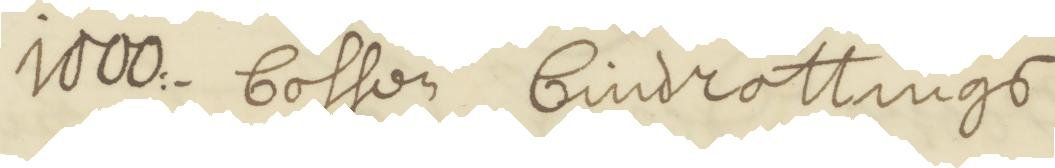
1000:- bossen bindrottings
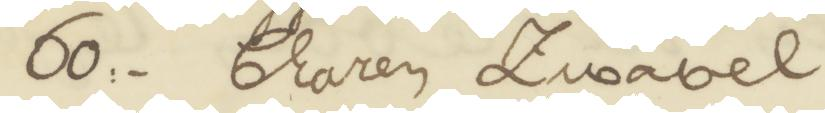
60:- bharen zwavel
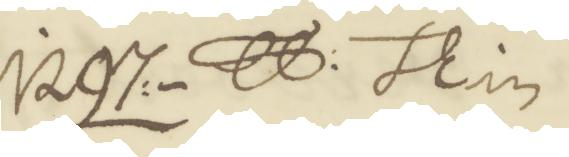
1297:- lb: thin
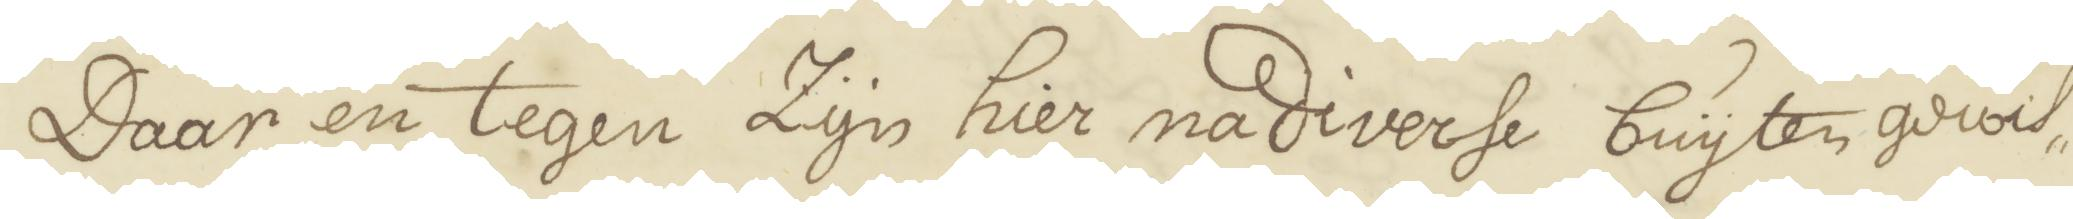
Daar en tegen zijn hier na diverse buijten gewis„
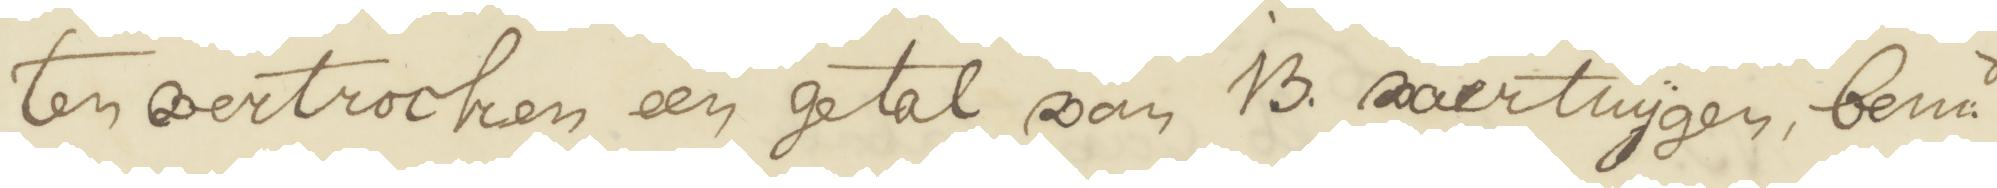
ten vertrocken een getal van 13. vaertuijgen, bem:d
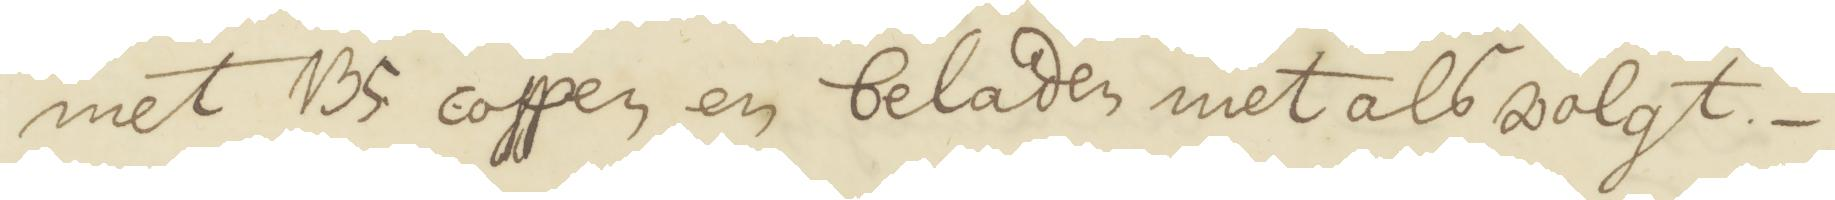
met 135. coppen en beladen met als volgt.—
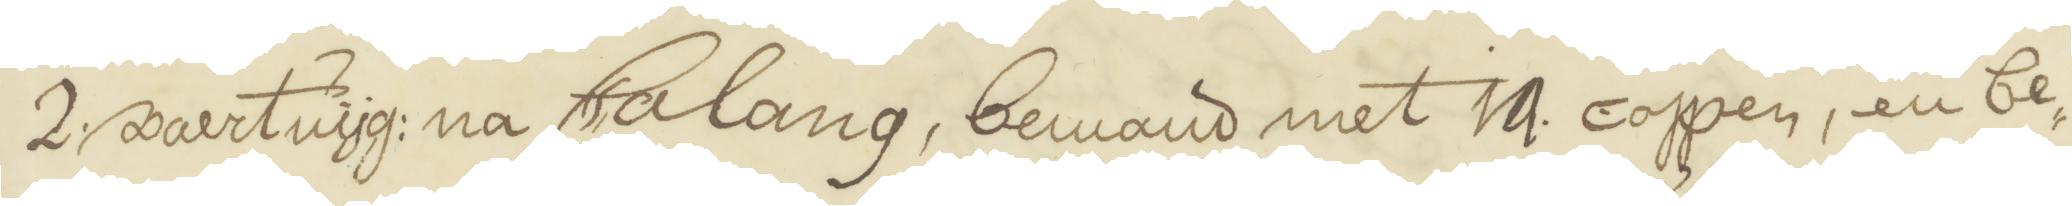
2. vaertuijg: na Calang, bemand met 14. coppen, en be„
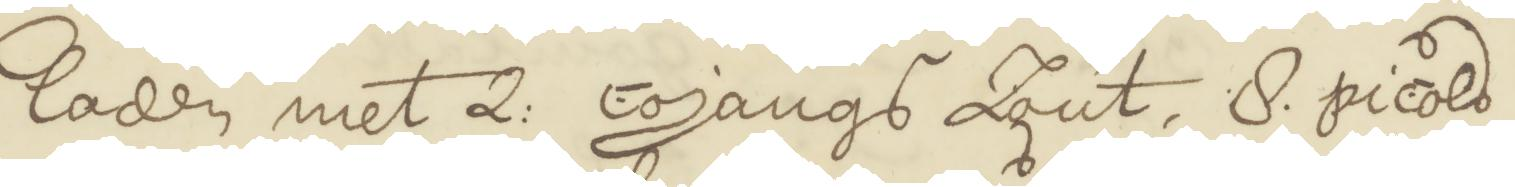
laden met 2: cojangs zout, 8. picols
